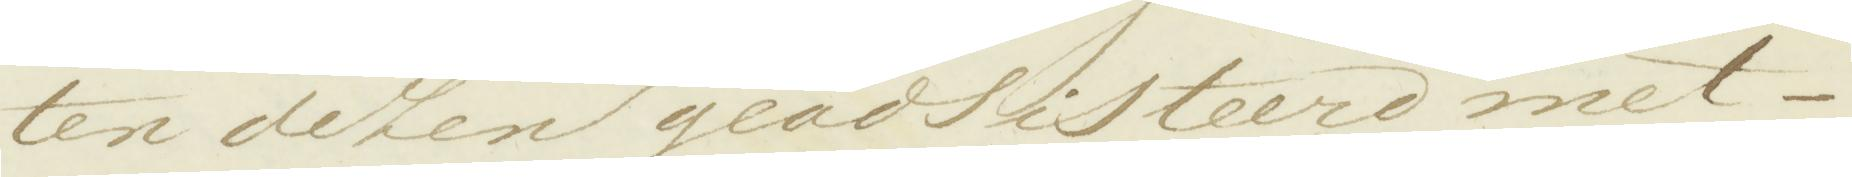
ten dezen geadsisteerd met-
